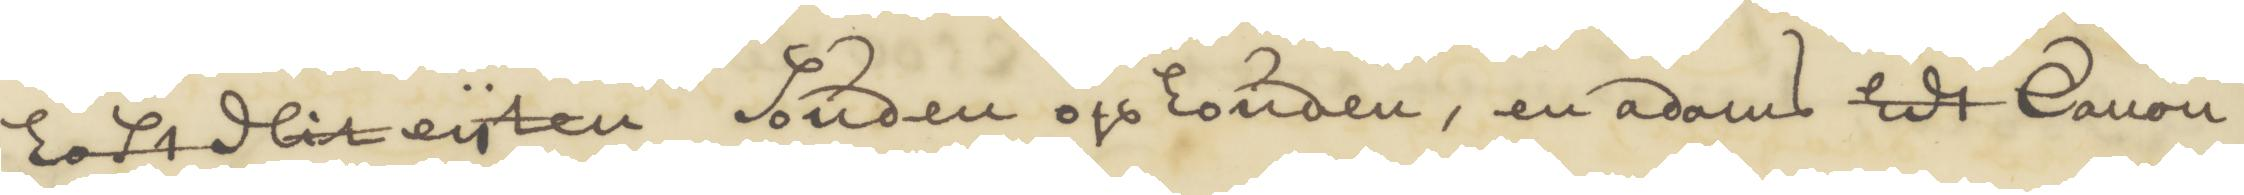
hosteliteijten souden ophouden, en adams het Canon
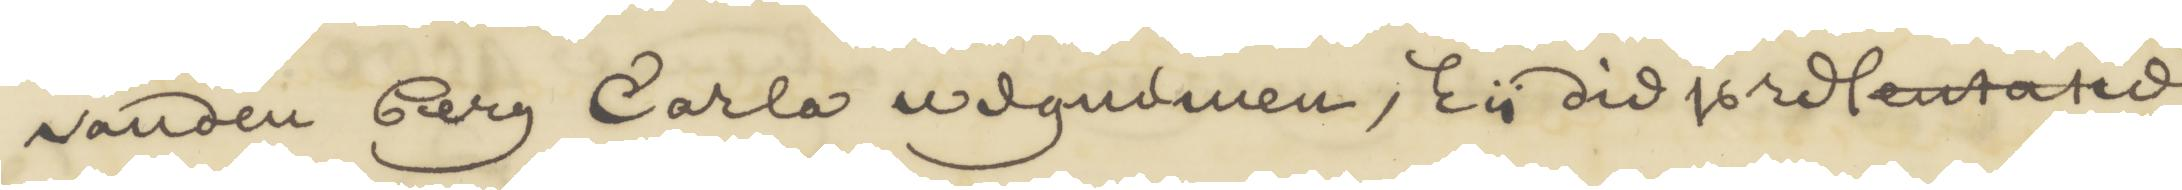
vanden berg Carla wegnemen, hij die presentatie
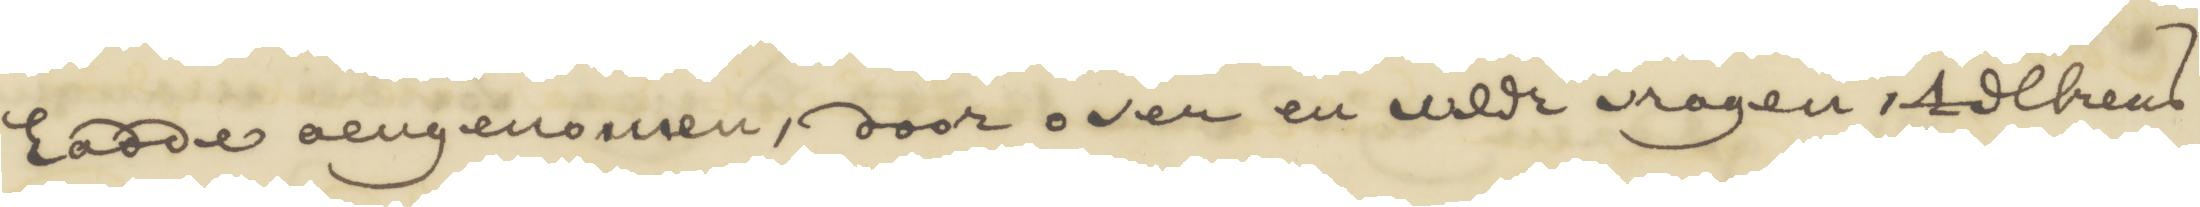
hadde aengenomen, door over en weer vragen, telkens
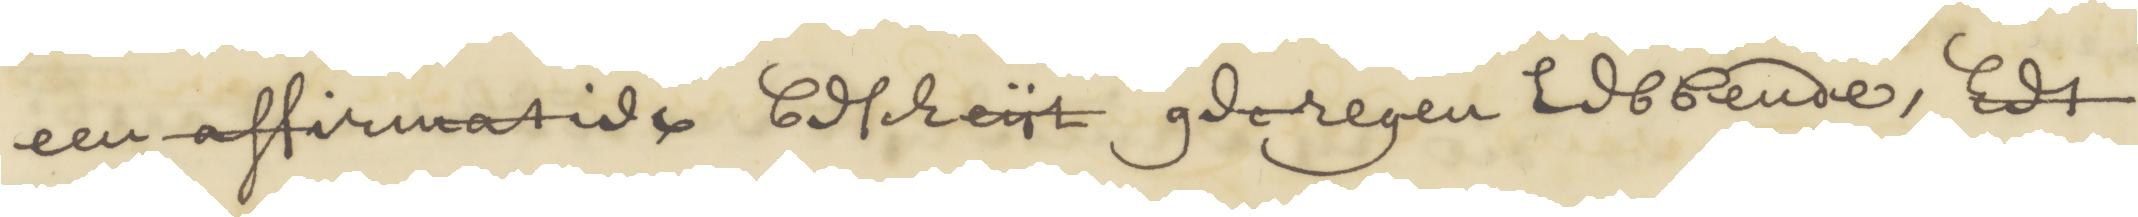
een affirmatie en bescheijt gecregen hebbende, het
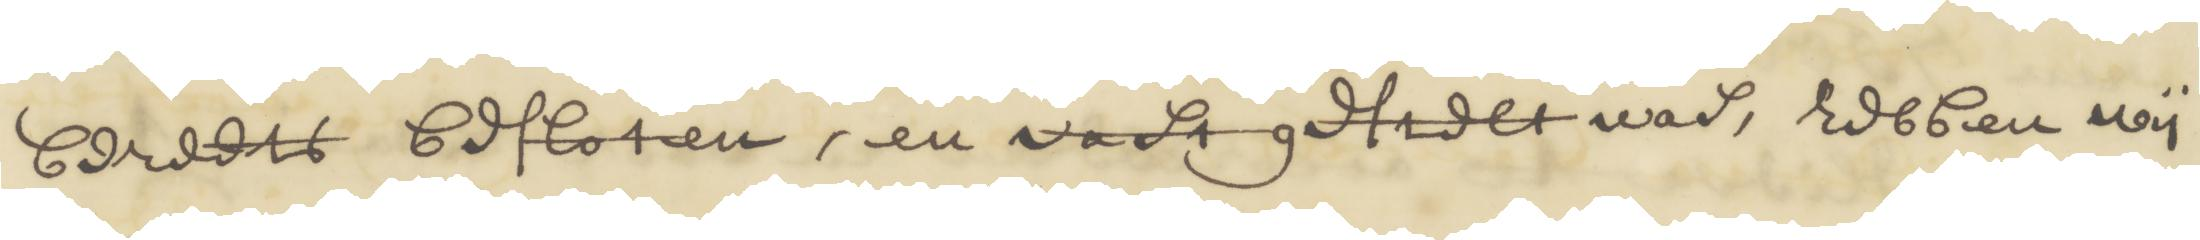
bereets besloten, en vast gestelt was, hebben wij
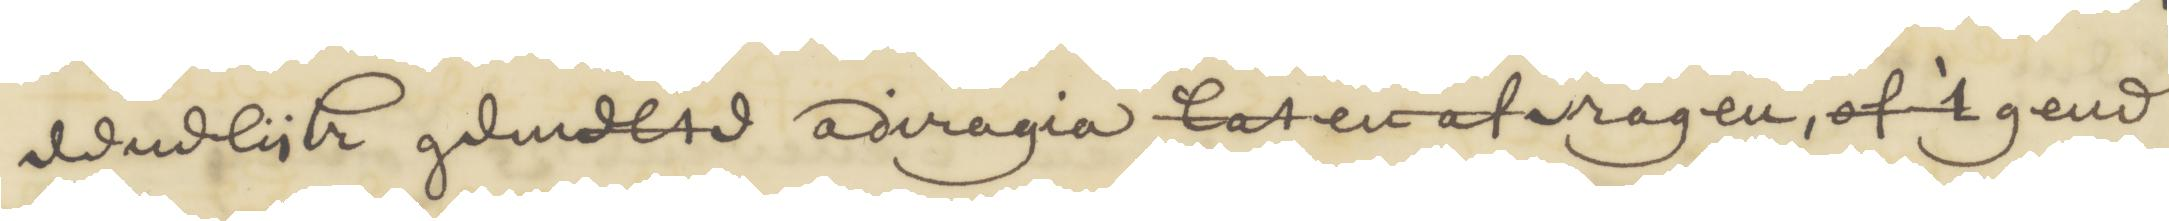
eenelijk gemelte adiragia laten afvragen, of ’t gene
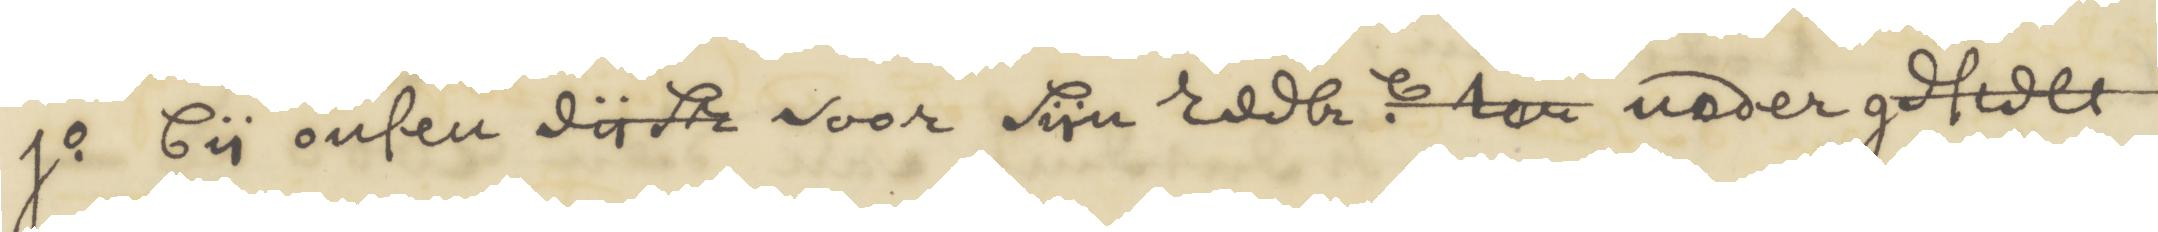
j.o bij onsen eijsch voor sijn reek.s tor nader gestelt
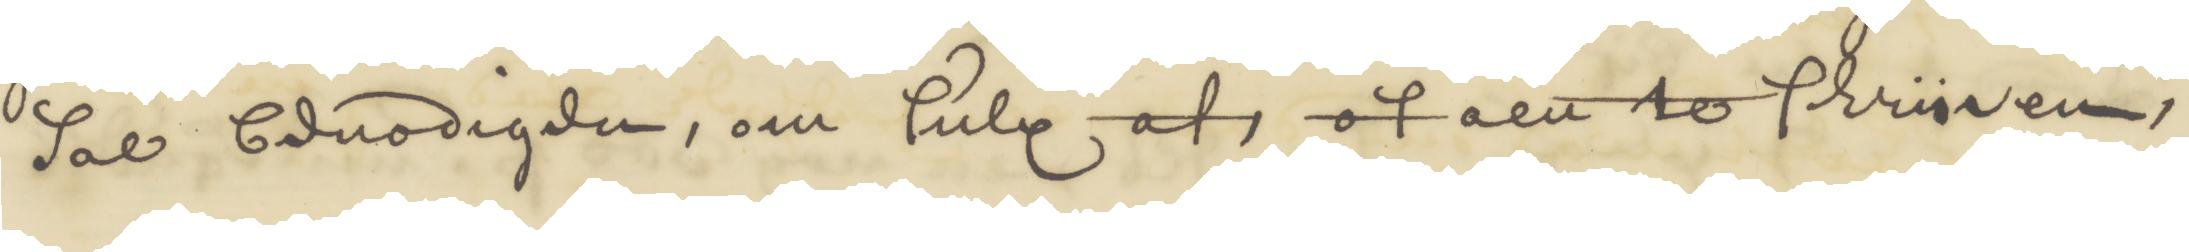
sal benodigen, om sulx af, of aen te schrijven,
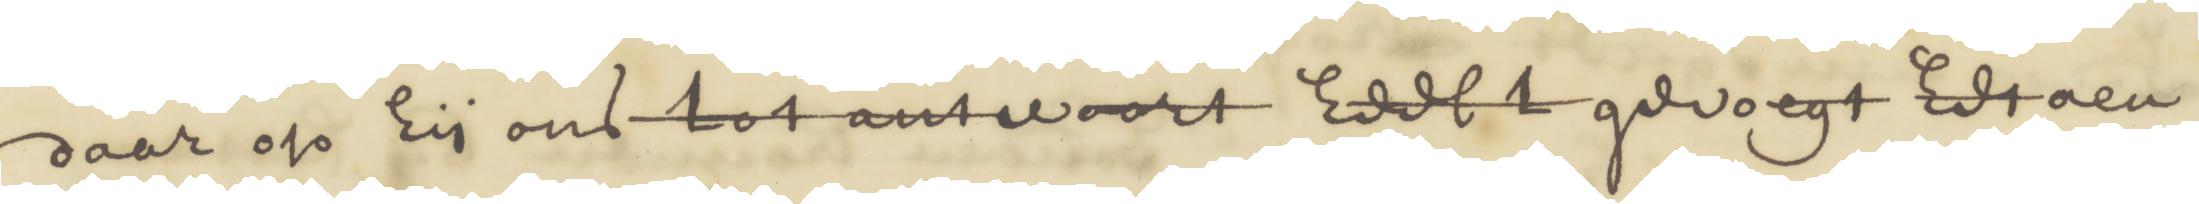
daar op hij ons tot antwoort heeft gevoegt het aen
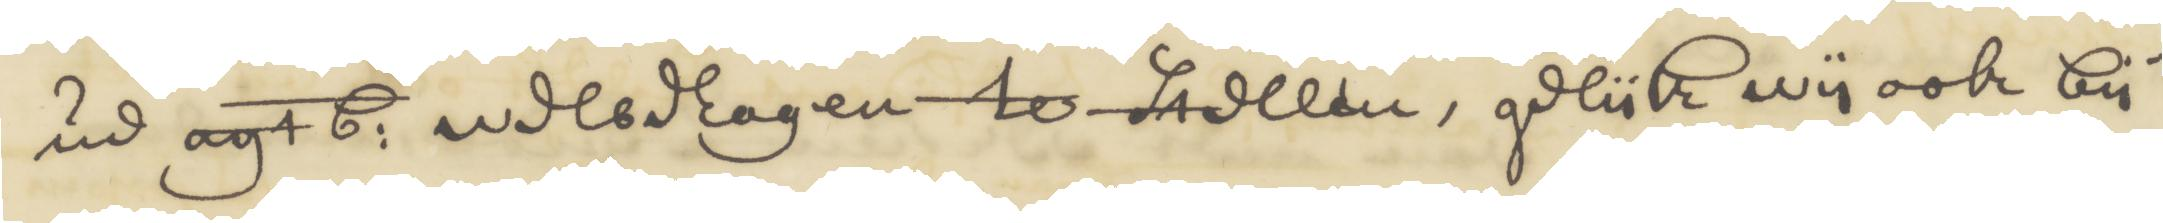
uE agtb: welbehagen te stellen, gelijk wij ook bij
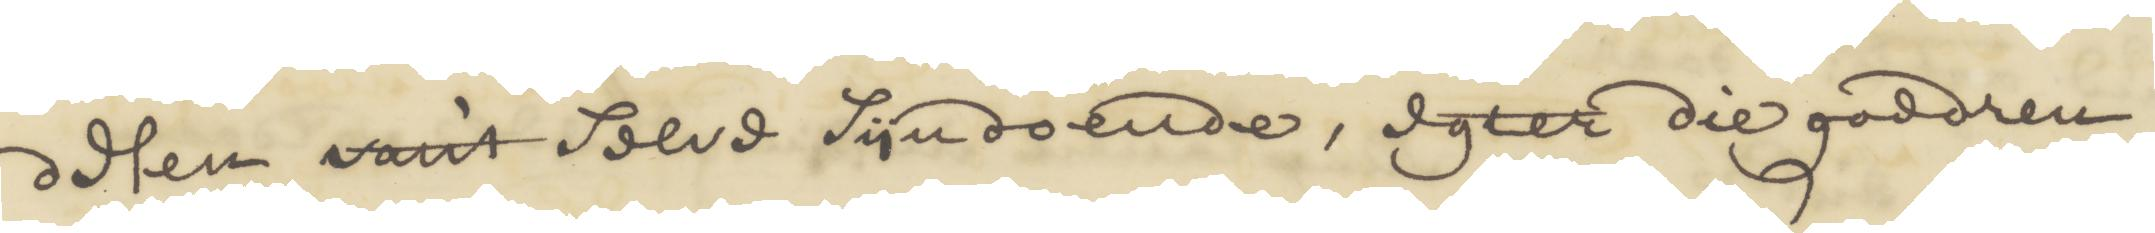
desen van’t selve sijn doende, egter die goedren
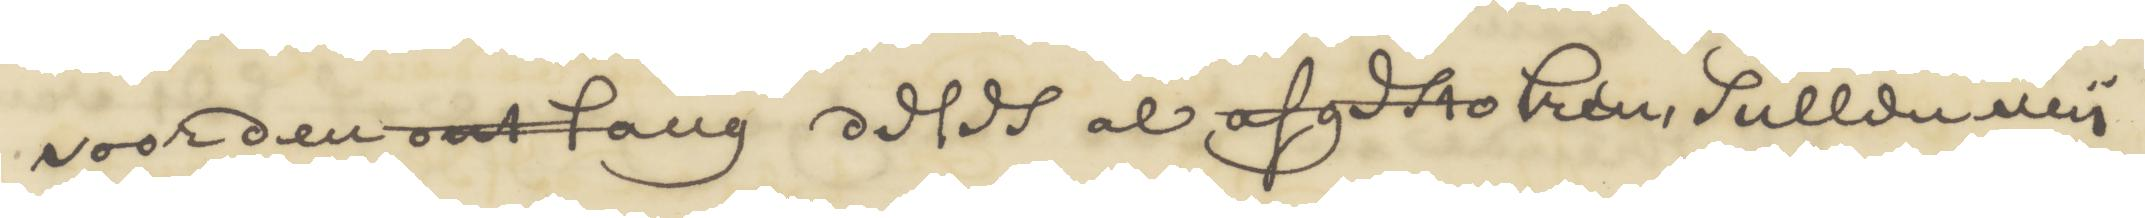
voor den ontfang deses al afgestoken, sullen wij
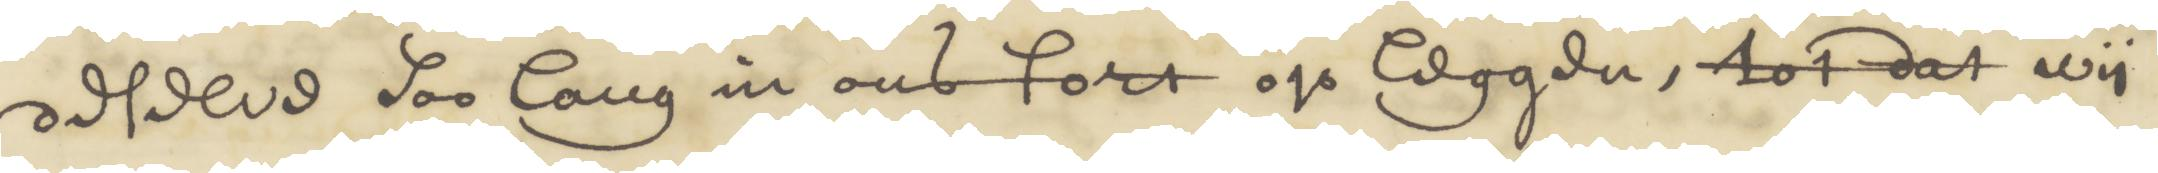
deselve soo lang in ons fort op leggen, tot dat wij
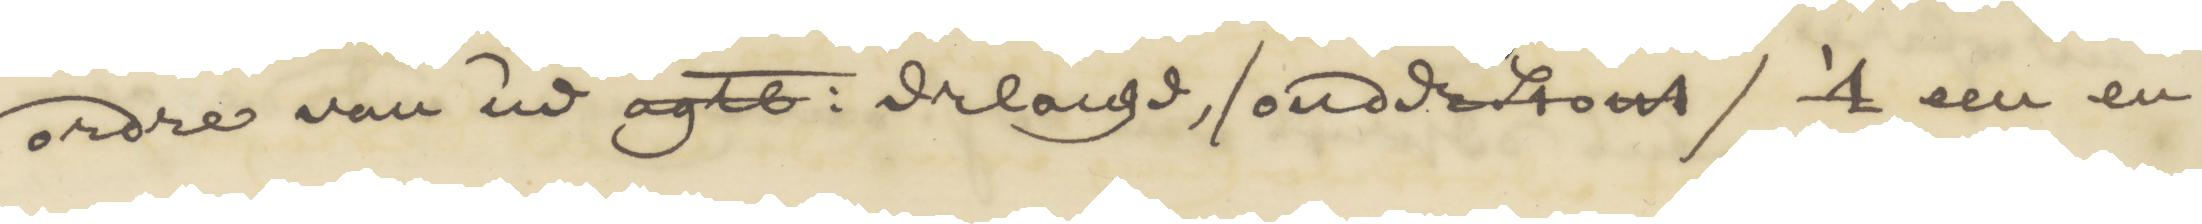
ordre van ue agtb: erlange, /onderstont/ ’t een en
